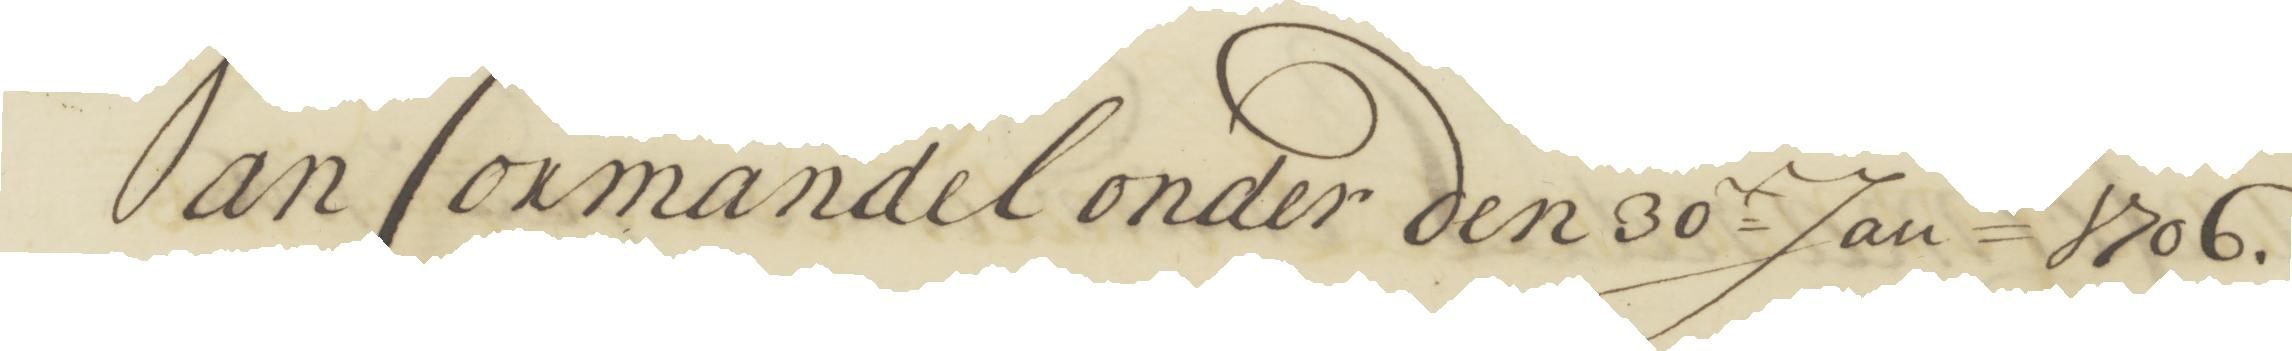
Van Cormandel onder den 30:' Jan=y 1706.
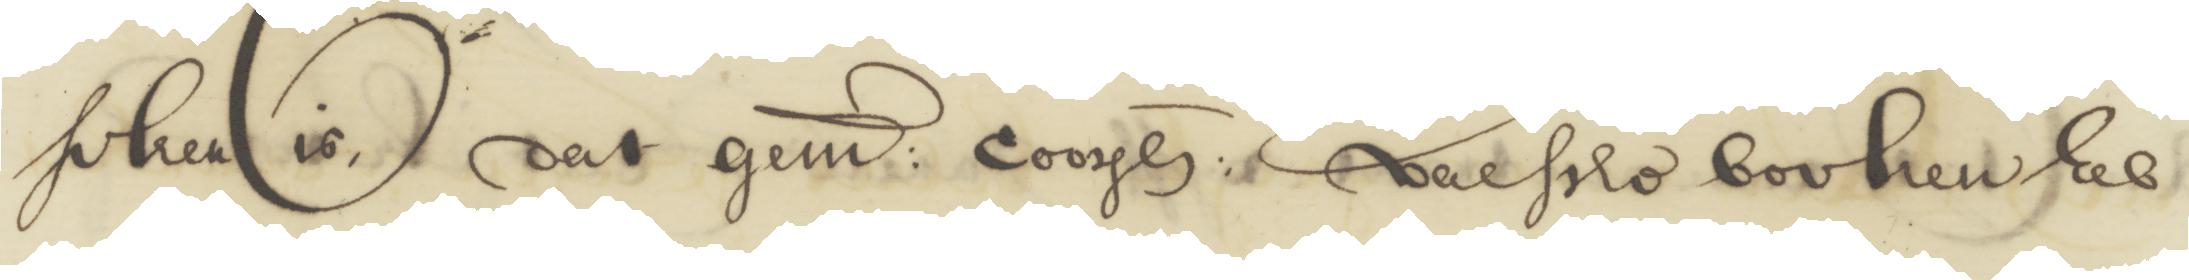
seker is. dat gem: coopl: valsche boeken heb
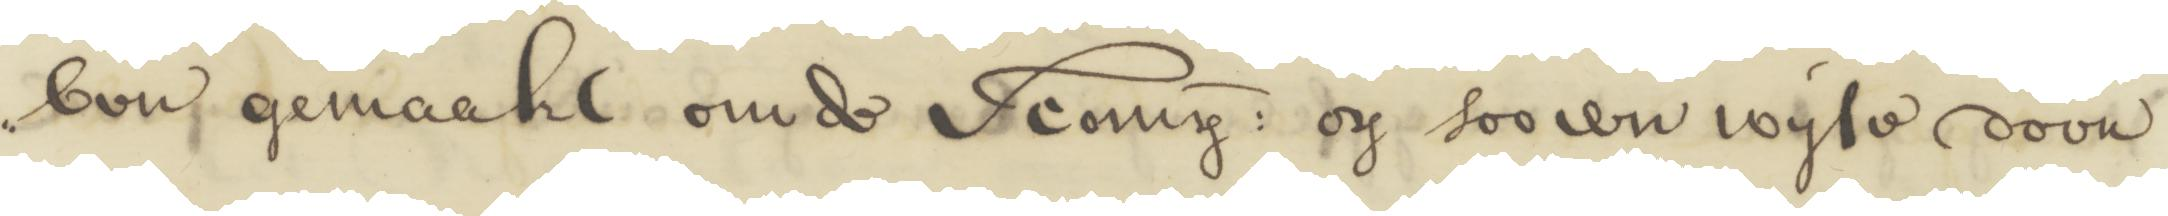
„ben gemaakt om de E comp: op soo een wijse door
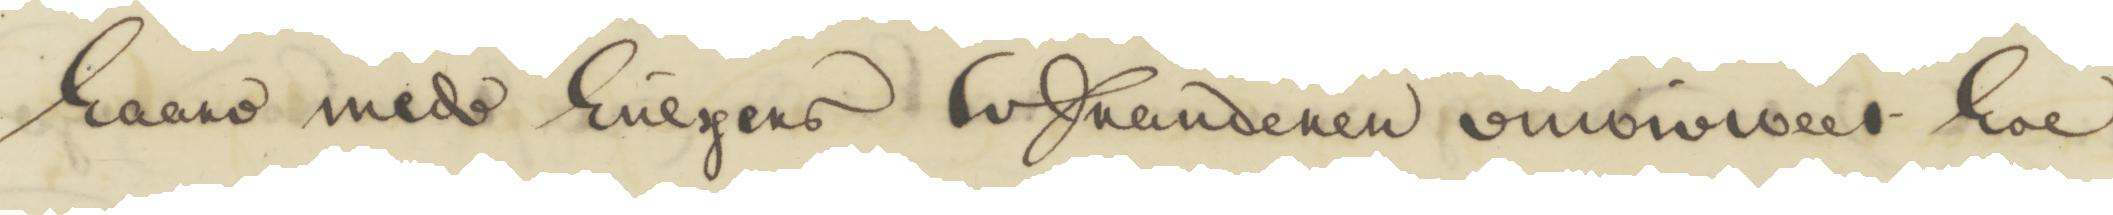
haare mede hulpers te frauderen en wieweet hoe
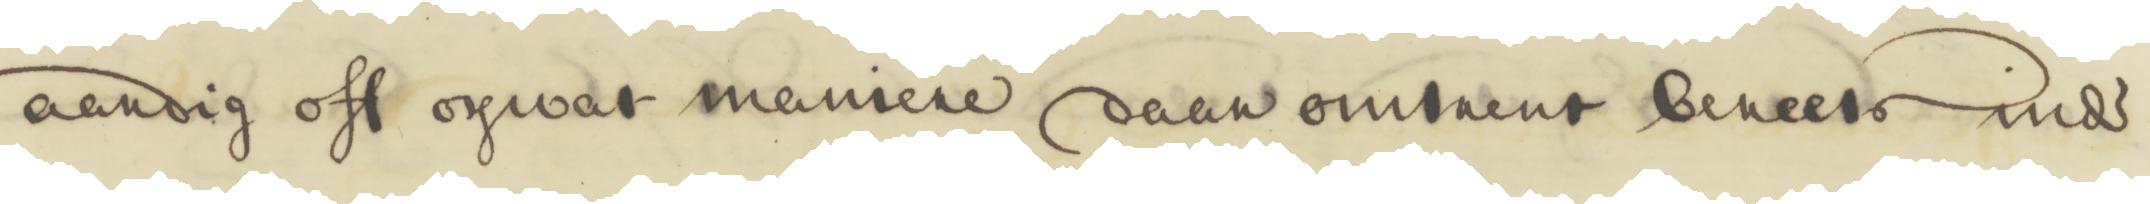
aardig oft opwat maniere daar omtrent bereets inde
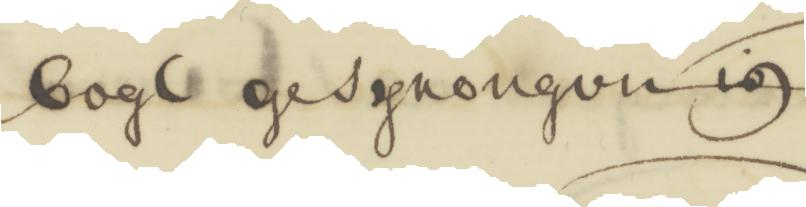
bogt gesprongen is
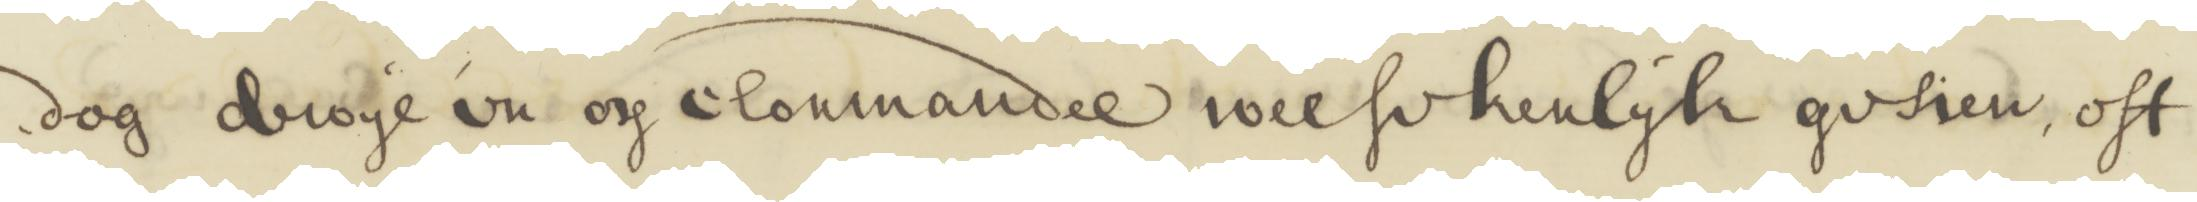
dog dewijl en op chormandel wel sekerlijk gesien, oft
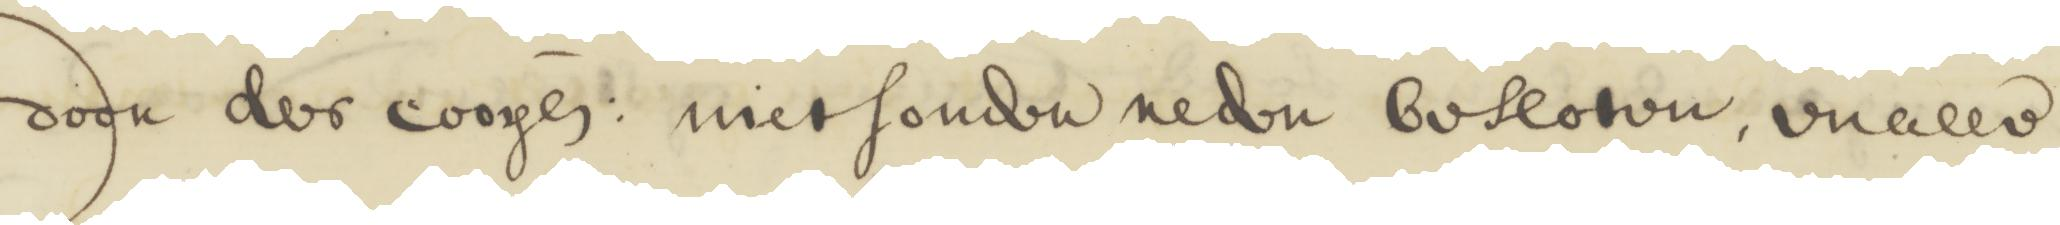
door dees coopl: niet sonder reden besloten, en alle
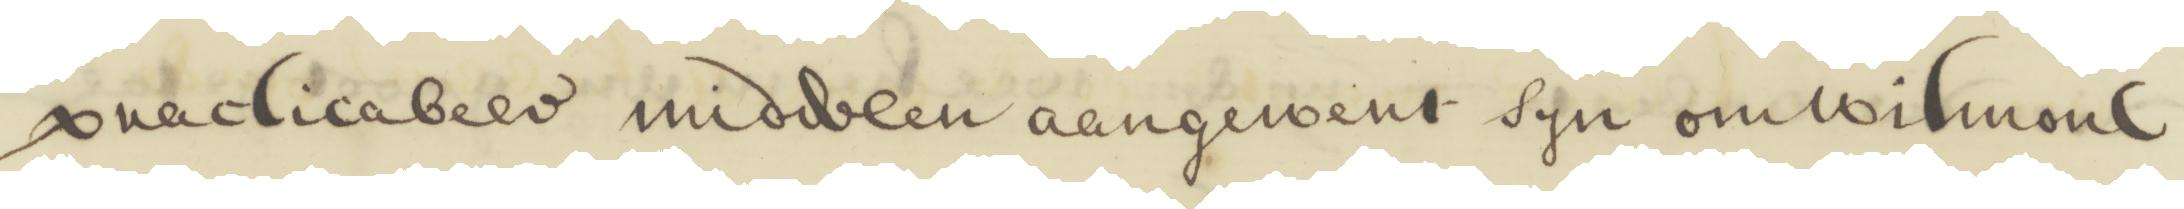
practicabele middelen aangewent sijn omwitmont
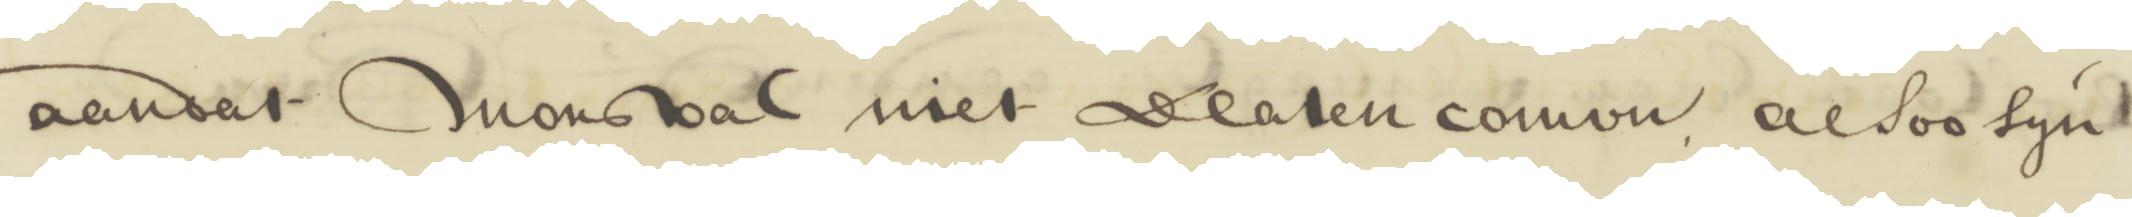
aandat morsvat niet te laten comen, alsoo sijn
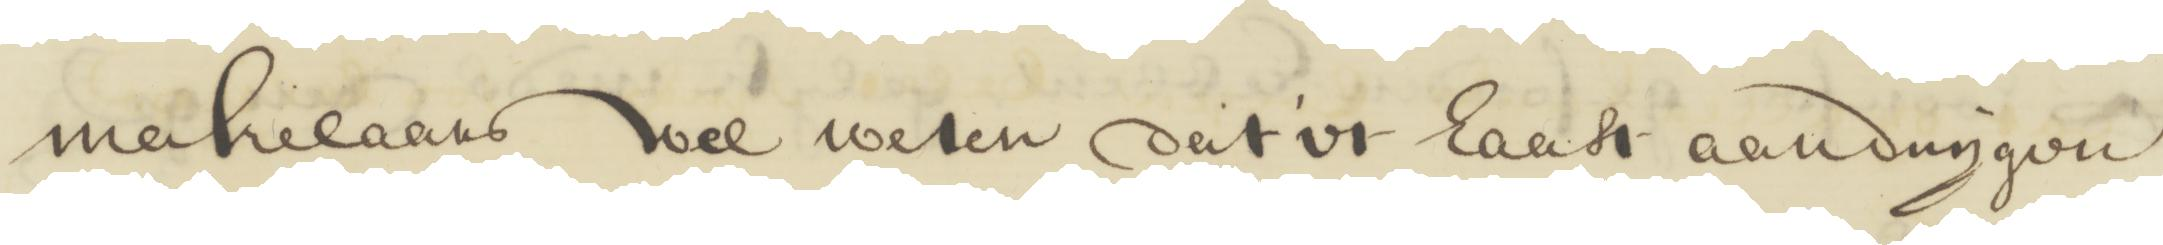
makelaars wel weten dat 'et haast aanduijgen
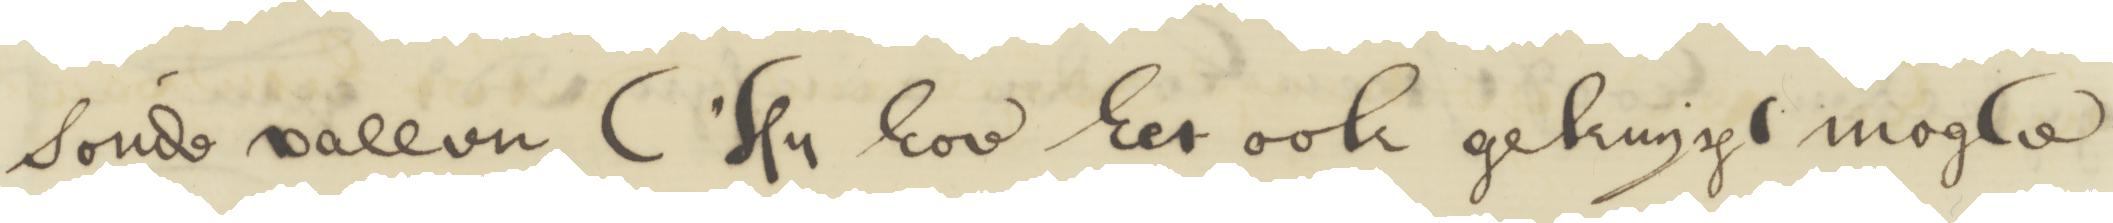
soude vallen, ( 'tsy hoe het ook gekuijpt mogte
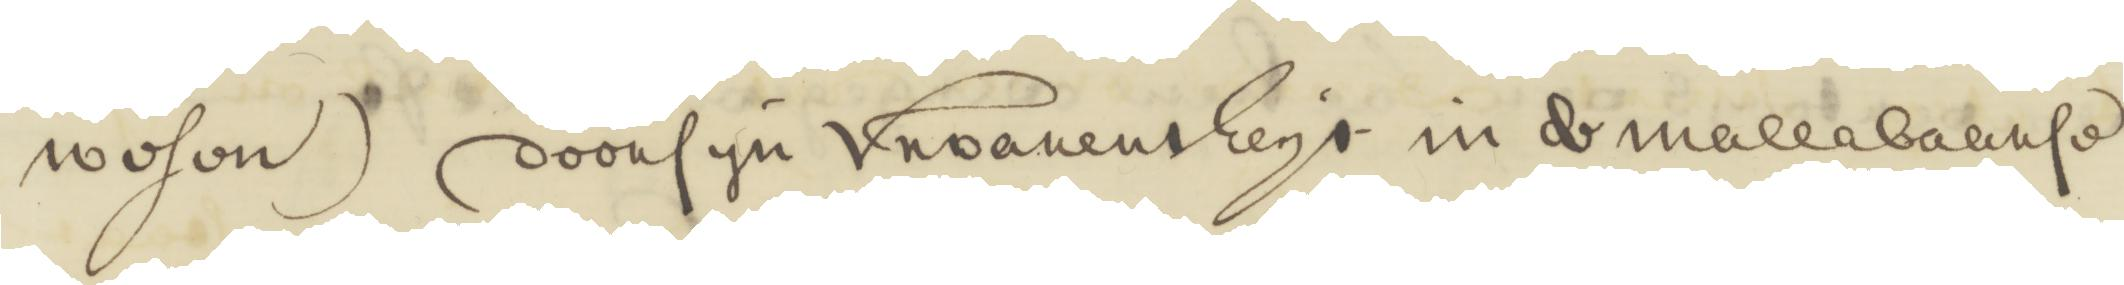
wesen) door sijn Ervarentheijt in de mallabaarse
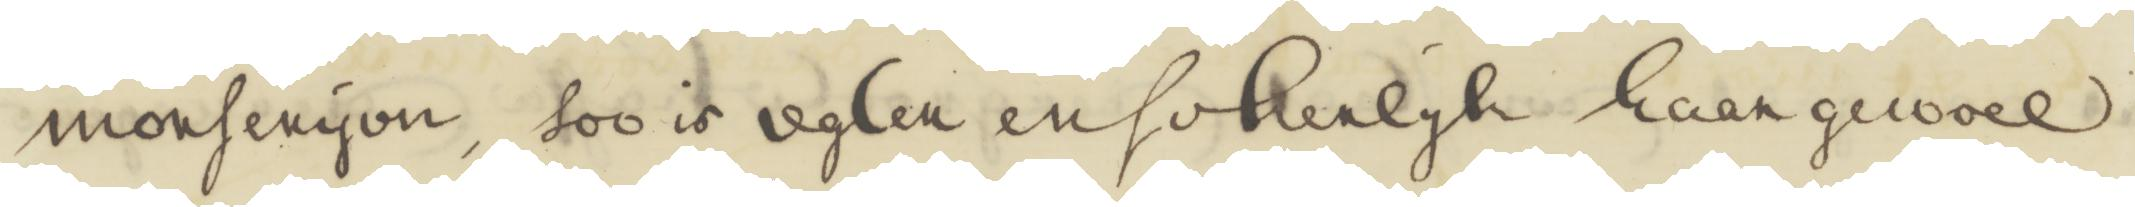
morserijen, soo is egter en sekerlijk haar gewoel
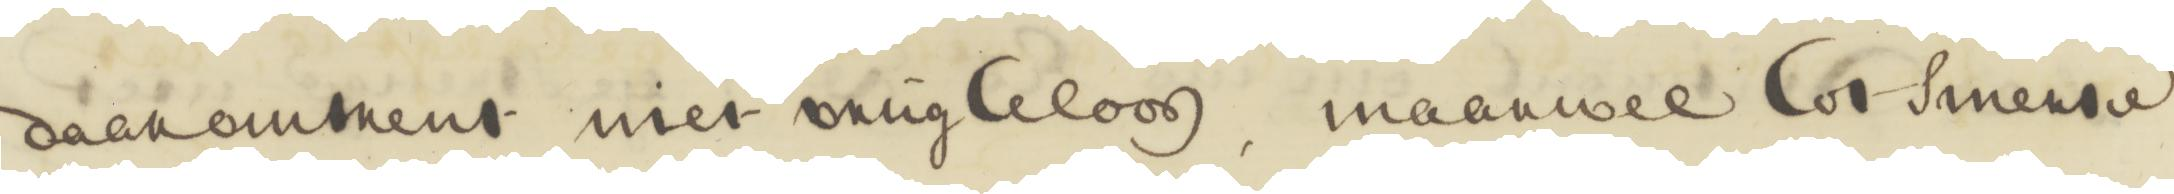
daar omtrent niet vrugteloos, maarwel tot smerte
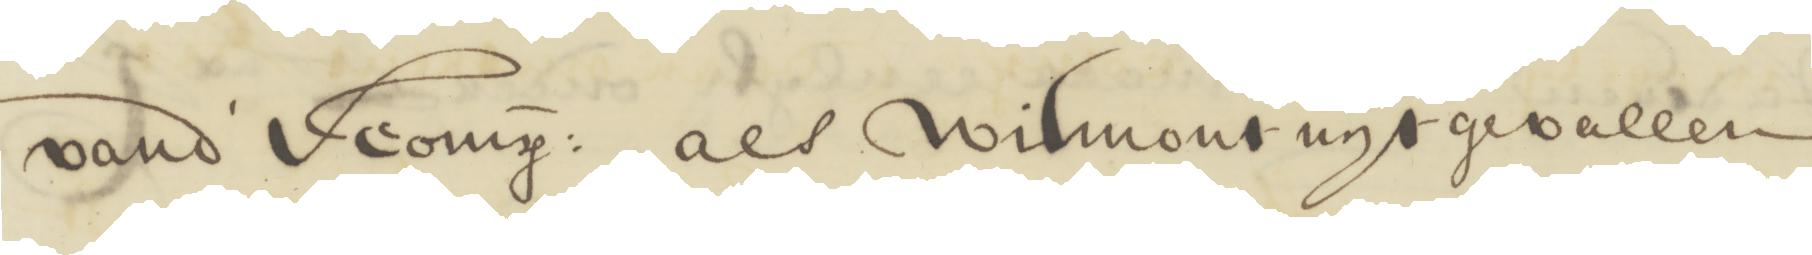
vand’ Ecomp: als witmont uijt gevallen
